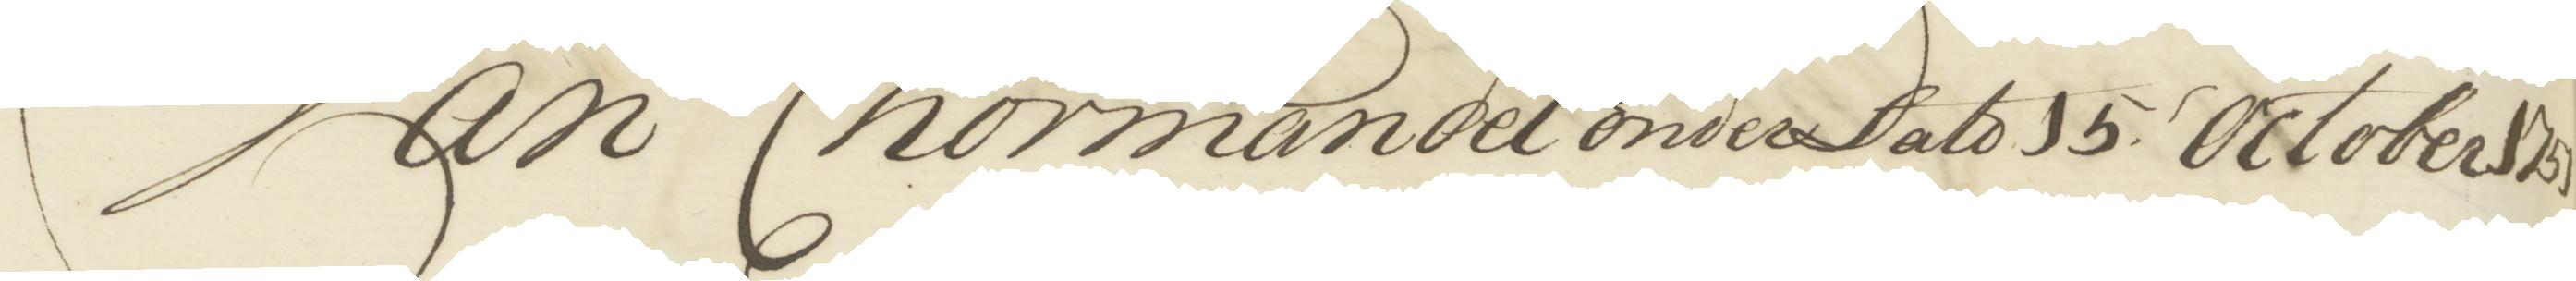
Van Chormandel onder Dato 15:en october 1751
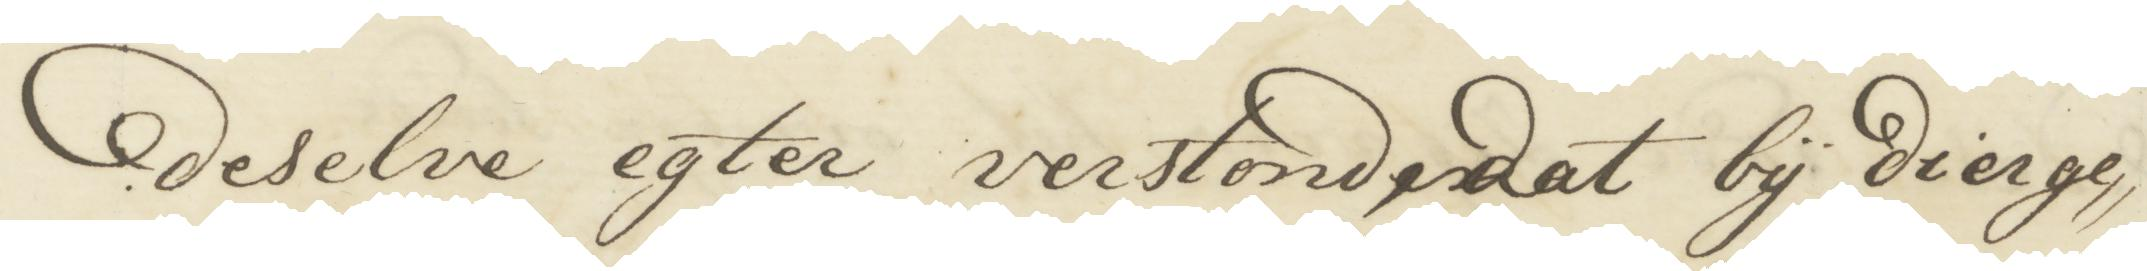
deselve egter verstond, dat bij dierge„
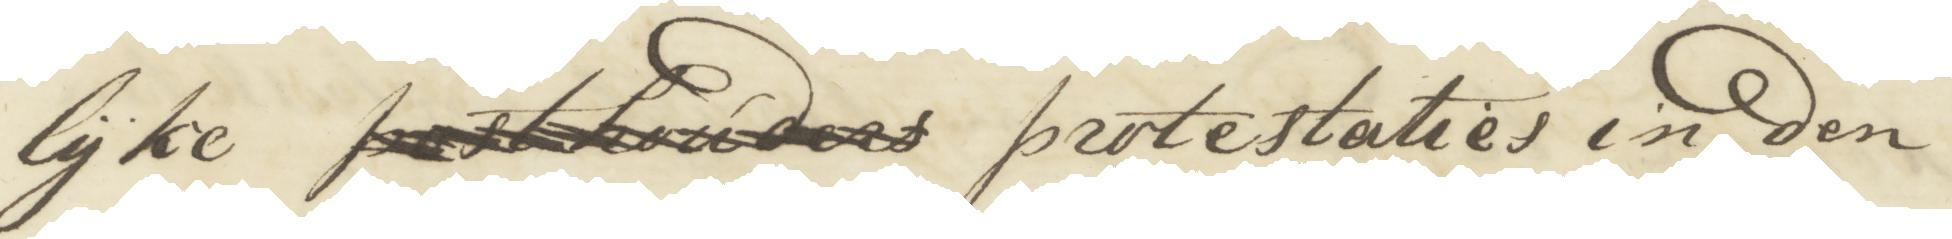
lijke posthouders protestaties in den
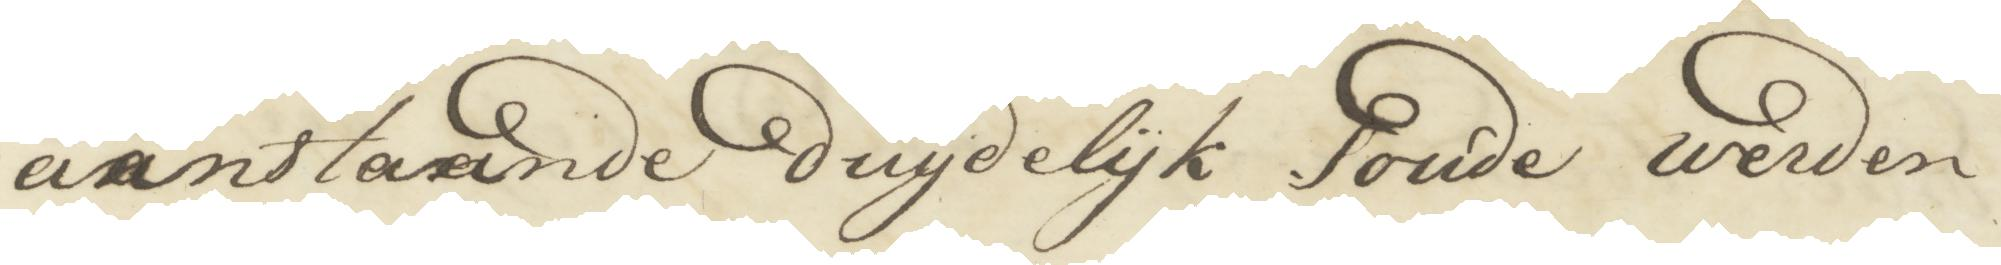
aanstaande duijdelijk soude werden
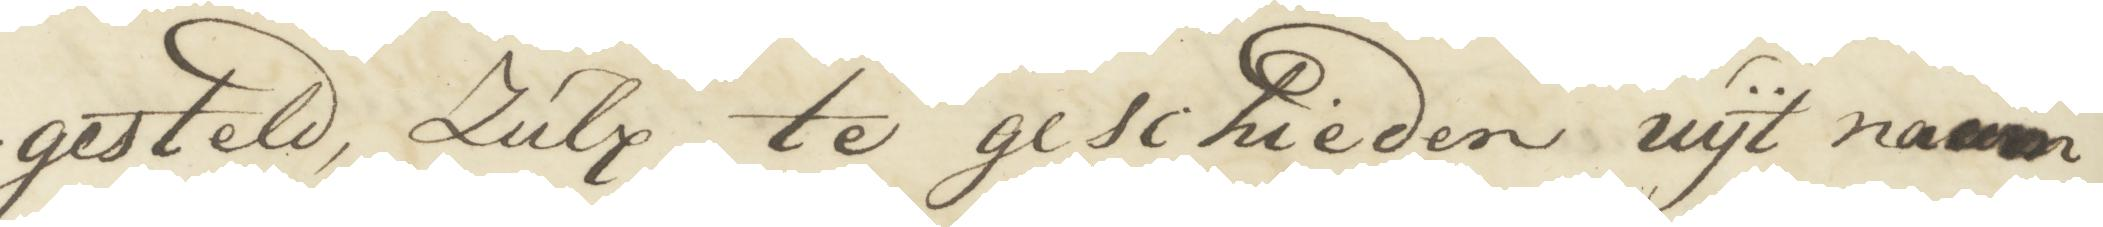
gesteld, zulx te geschieden uijt naam
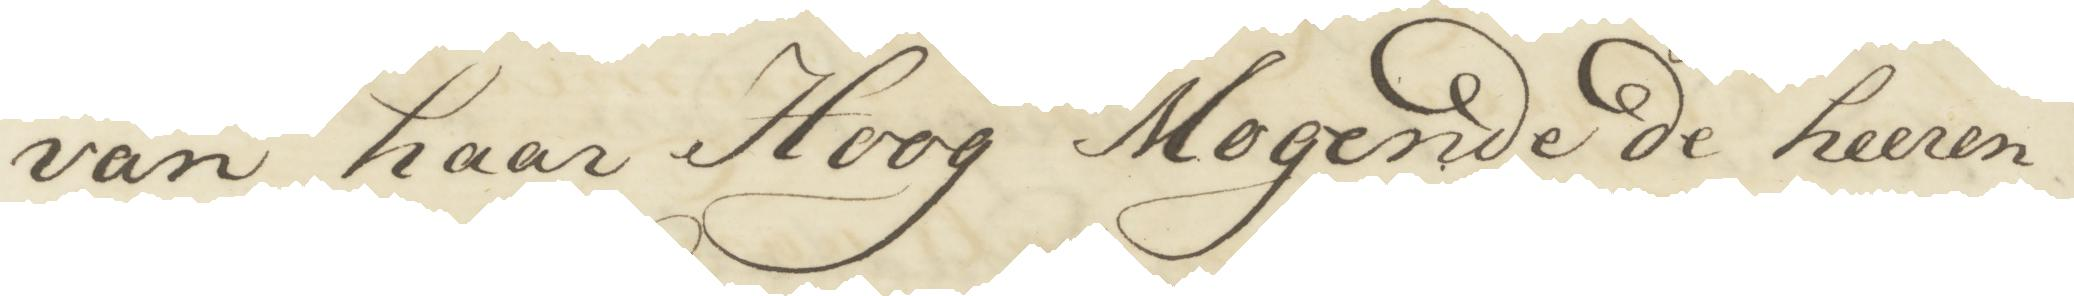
van haar Hoog Mogende de heeren
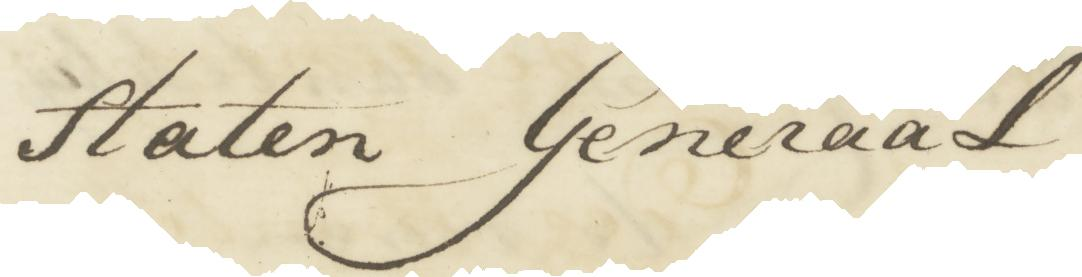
Staten Generaal
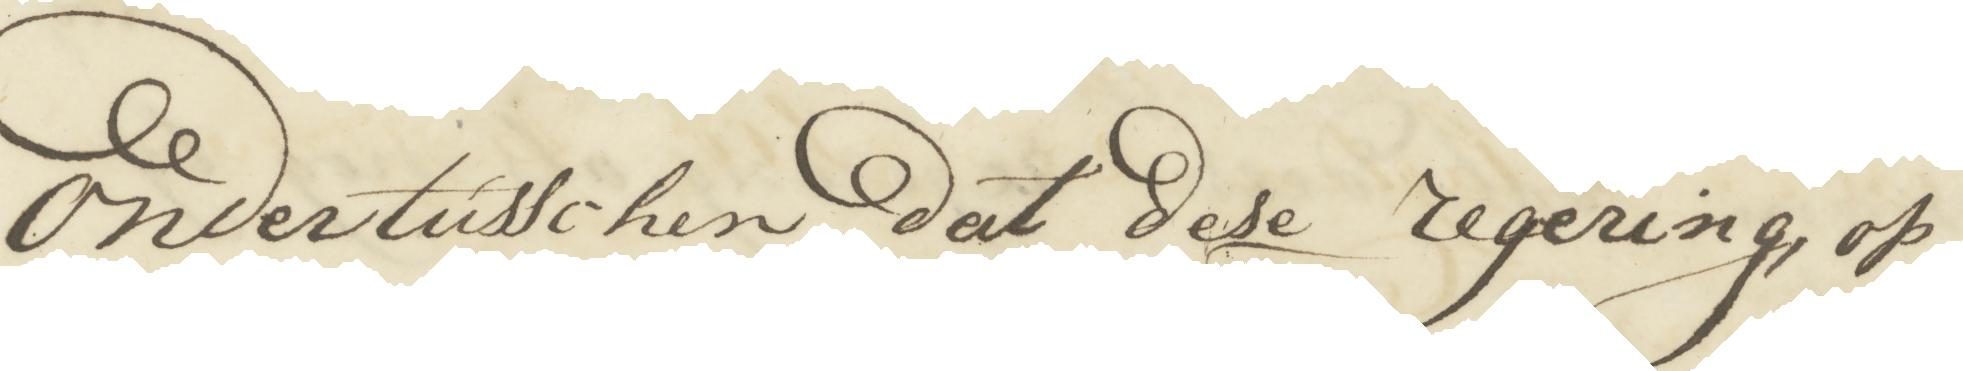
ondertusschen dat dese regering, op
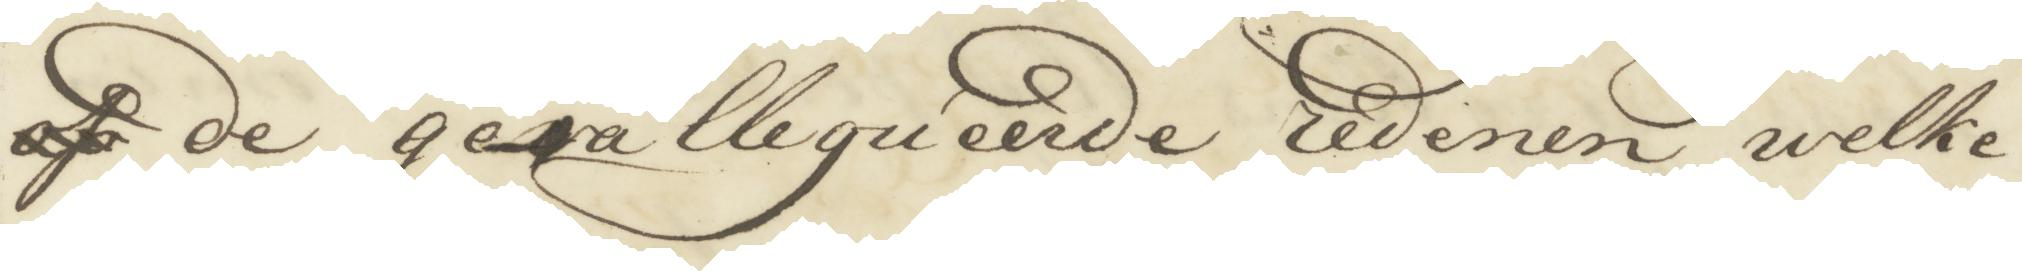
of de gevallegueerde redenen welke
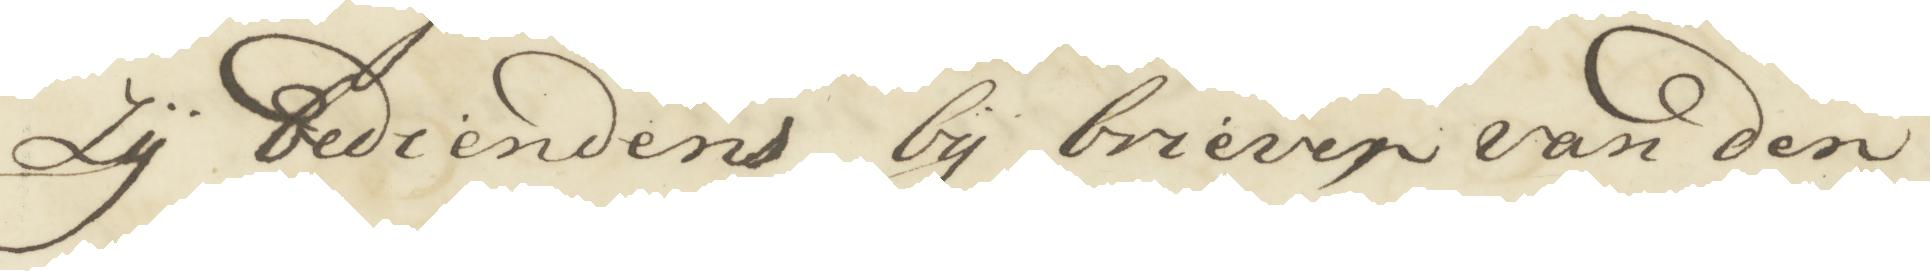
zij bediendens bij brieven van den
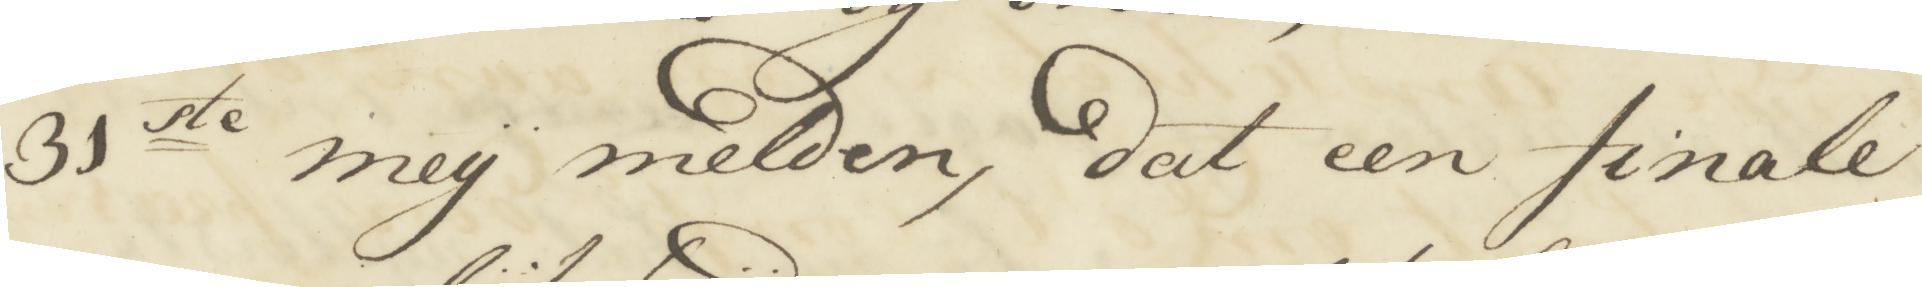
31=ste meij melden, dat een finale
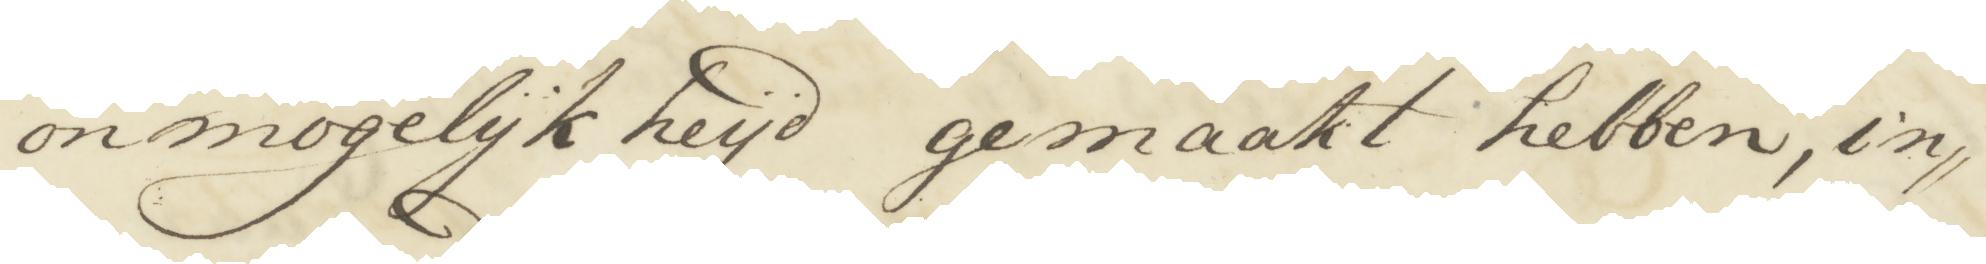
onmogelijk heijd gemaakt hebben, in„
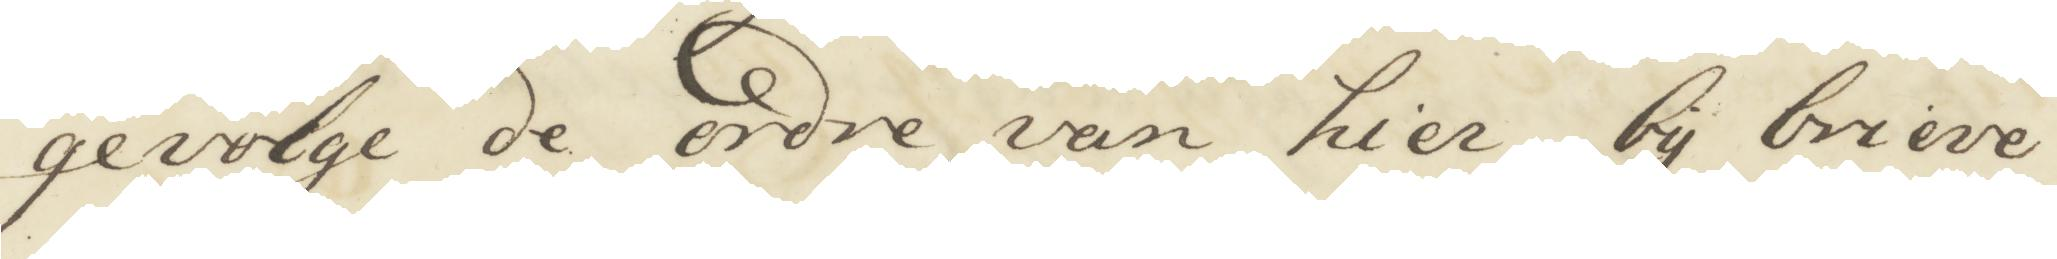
gevolge de ordre van hier bij brieve
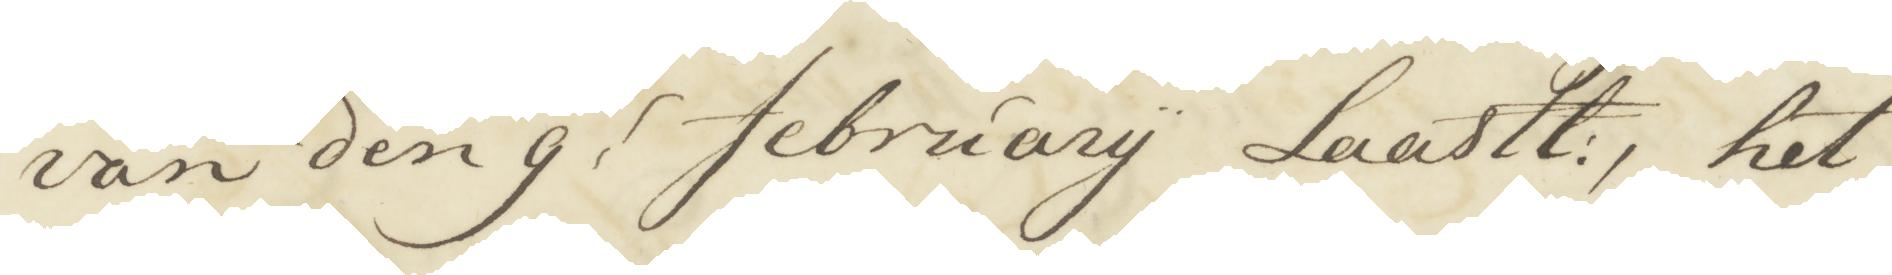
van den 9:' februarij Laastl:, het
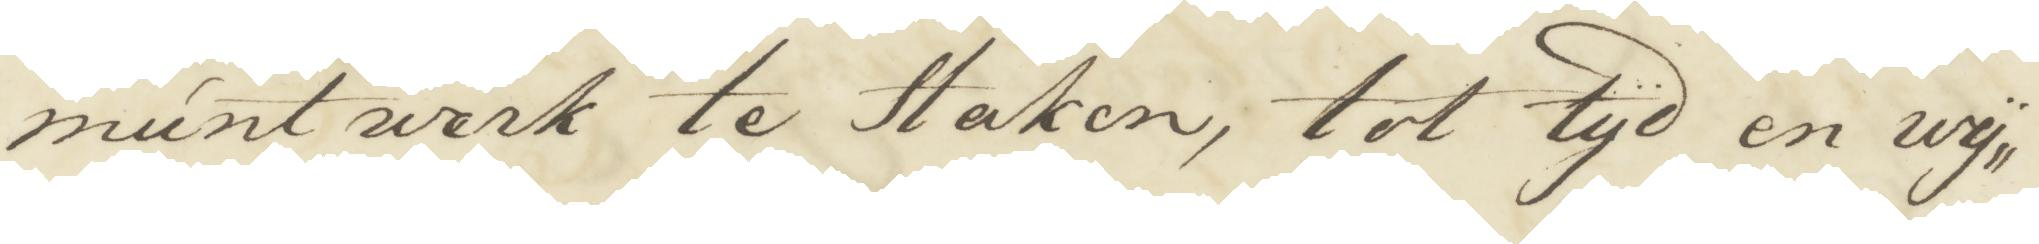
muntwerk te staken, tot tijd en wij„
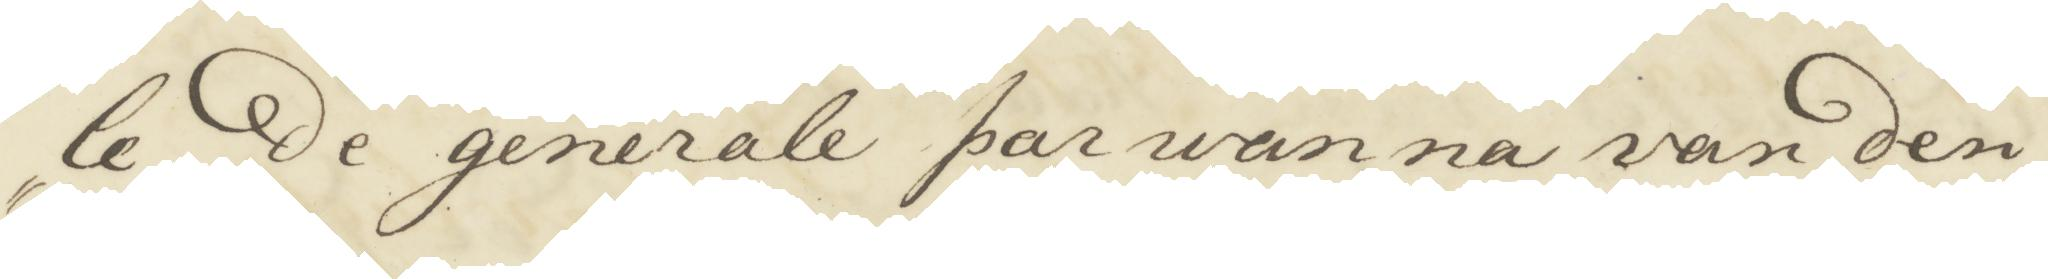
„le de generale par wanna van den
